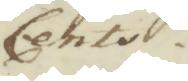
Cents .
